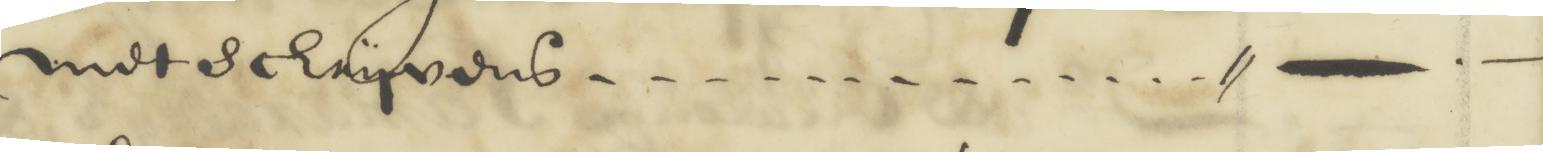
met schrijvens - - - - - - - - - - - - „ —.—
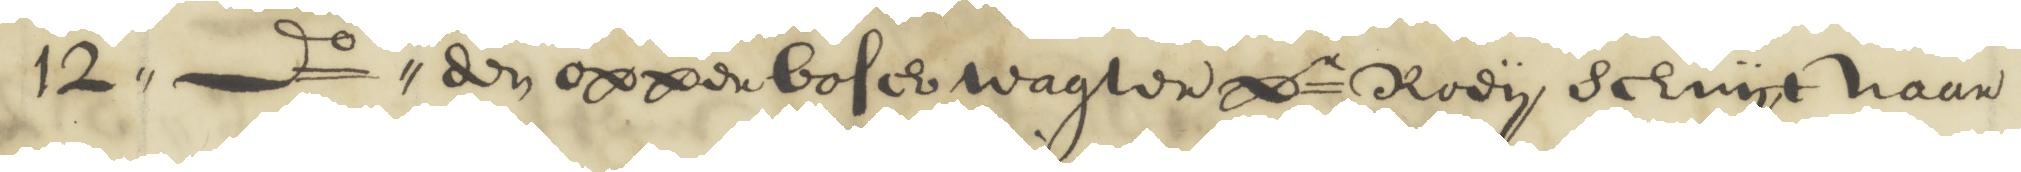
12 „ d=o „ den opper bosch wagter p=r Roeij schuijt naar
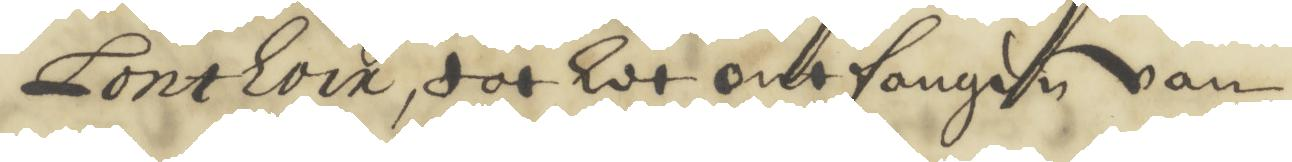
lonthoir, tot het ontfangen van
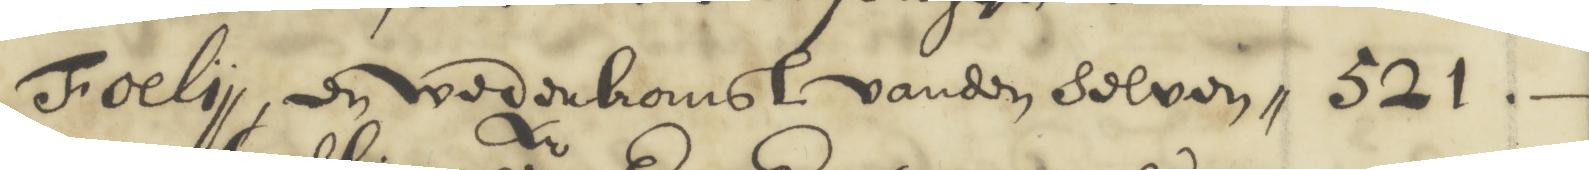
Foelij, en wederkomst van den selven „ 521 .—
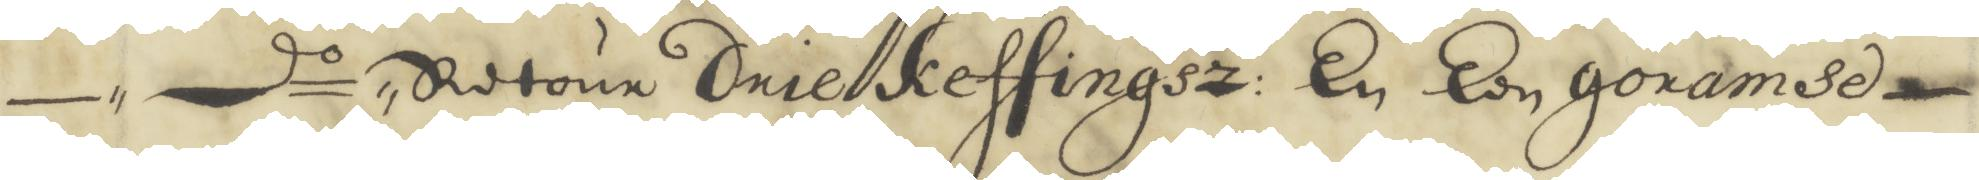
— „ d=o „ Retour drie keffingsz:r En Een goramse —
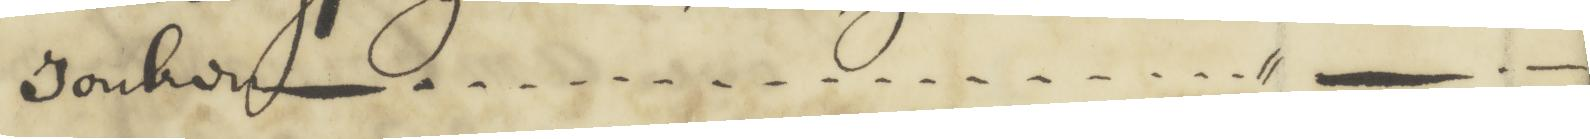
Jonken - - - - - - - - - - - - - - - - - „ —.—
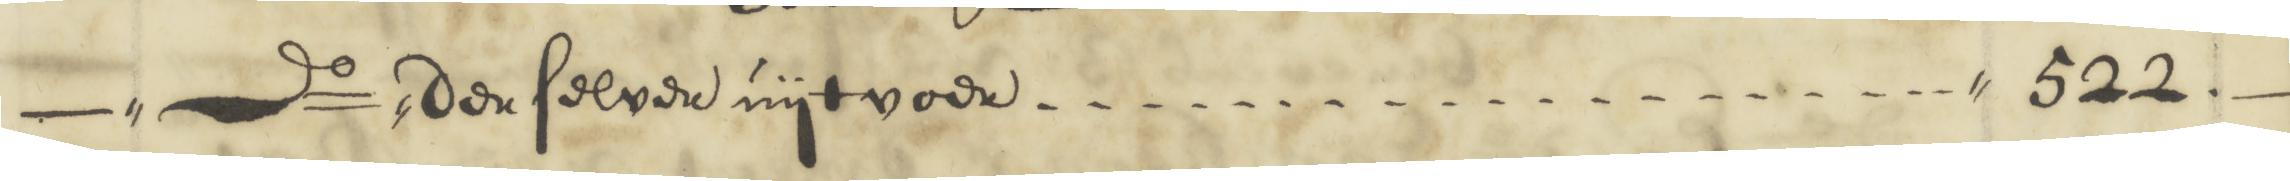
— „ d=o „ der selver uijtvoer - - - - - - - - - - - - - - - - - - - „ 522.—
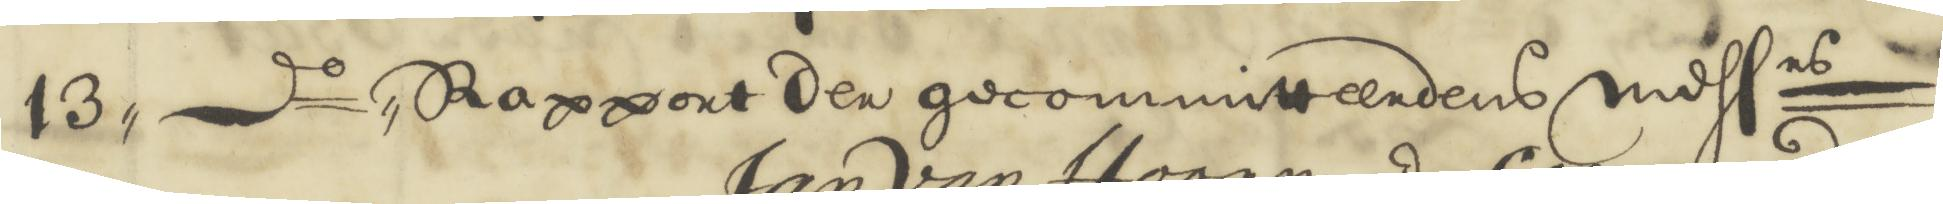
13 „ d=o „ Rapport der gecommitteerdens mess=rs
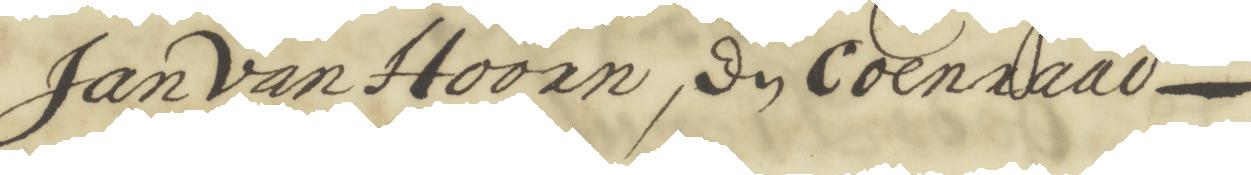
Jan van Hoorn, en Coenraad—
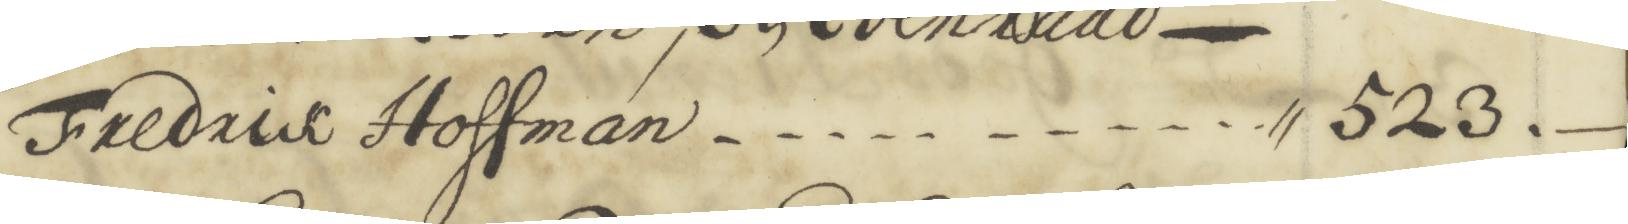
Fredrik Hoffman - - - - - - - - - - „ 523.—
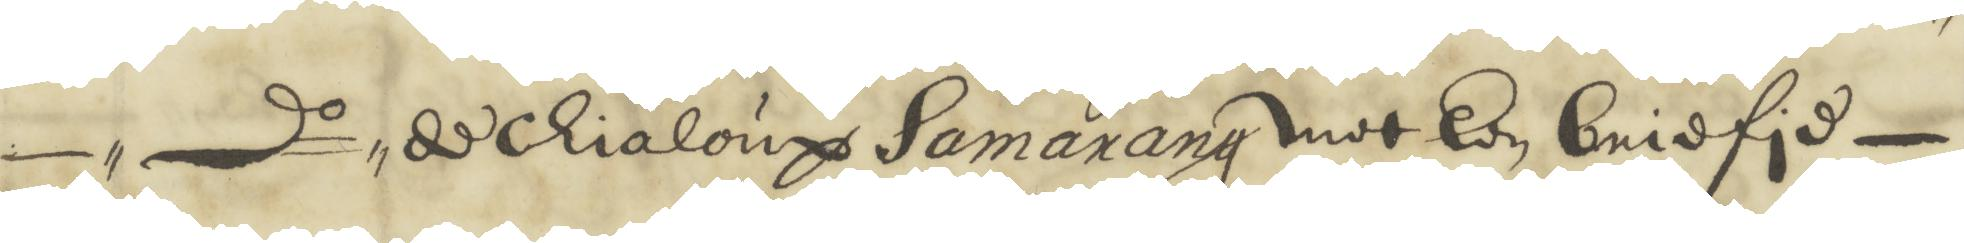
— „ d=o „ de chialoup Samarang met Een briefje —
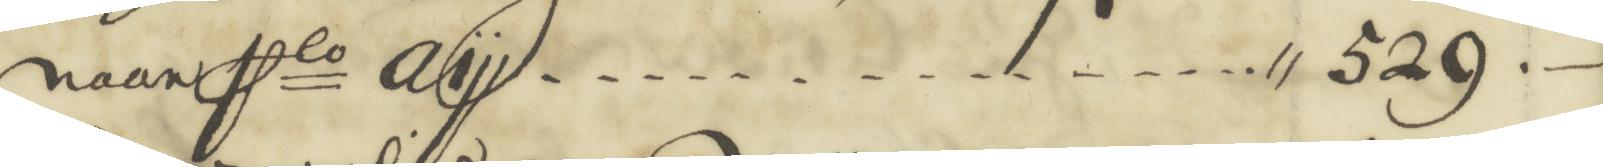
naar p=lo aij - - - - - - - - - - - - - - „ 529.—
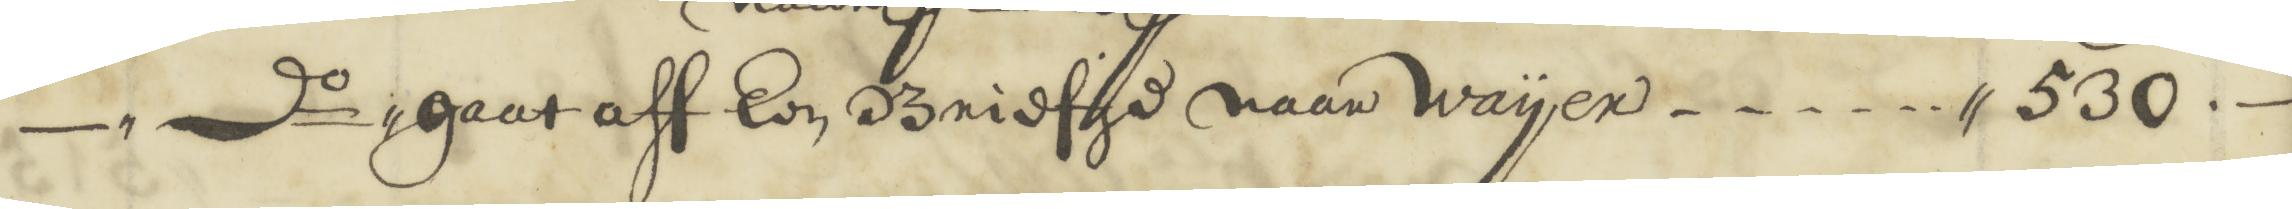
— „ d=o „ gaat aff Een Briefje naar waijer - - - - - - „ 530.—
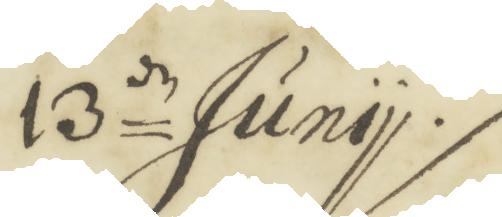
13=en Junij./
